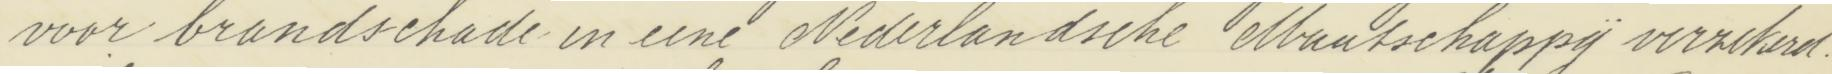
voor brandschade in eene Nederlandsche Maatschappij verzekerd
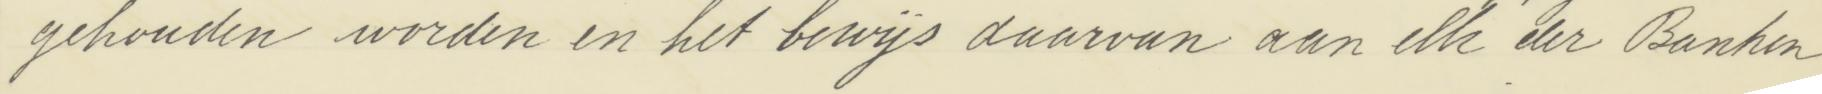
gehouden worden en het bewijs daarvan aan elk der Banken
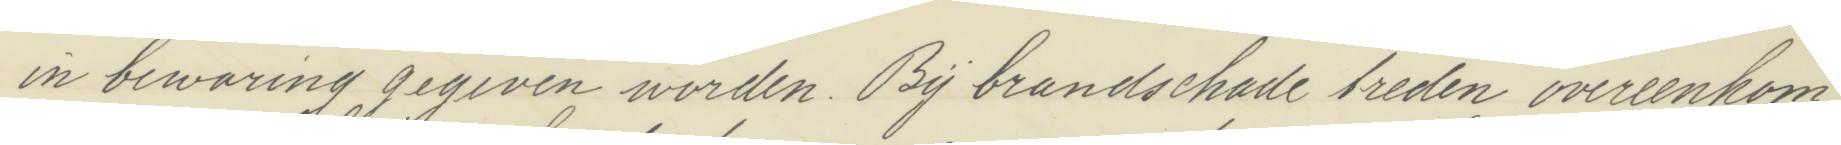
in bewaring gegeven worden. Bij brandschade treden overeenkom
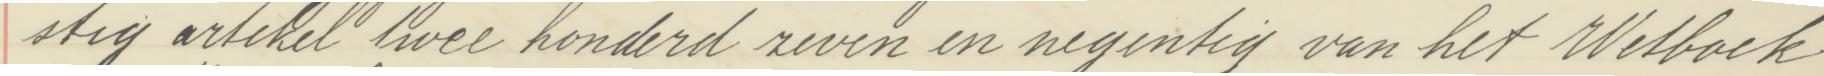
stig artikel twee honderd zeven en negentig van het Wetboek
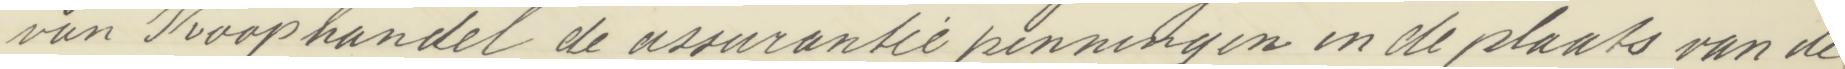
van Koophandel de assurantie penningen in de plaats van de
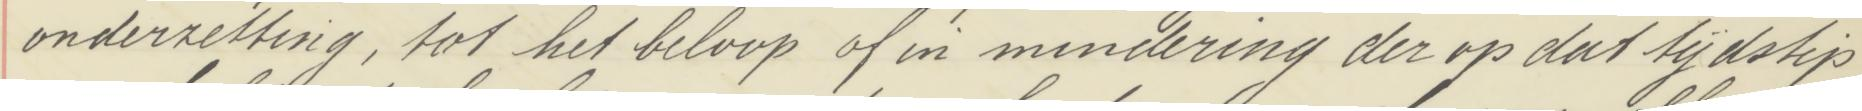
onderzetting, tot het beloop of in mindering der op dat tijdstip
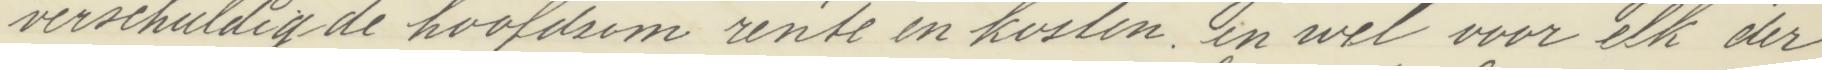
verschuldigde hoofdsom rente en kosten, en wel voor elk der
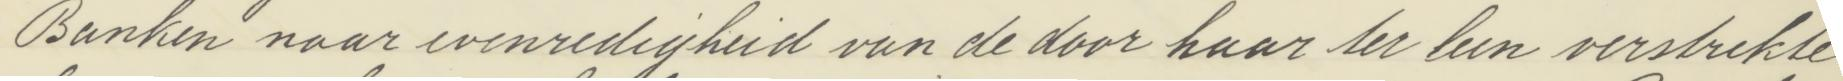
Banken naar evenredigheid van de door haar ter leen verstrekte
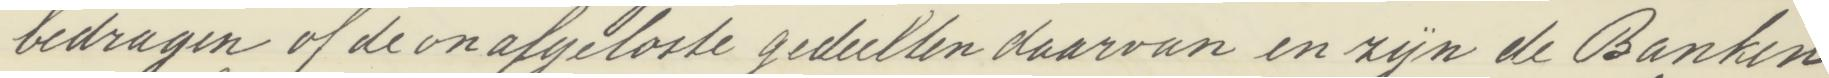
bedragen of de onafgeloste gedeelten daarvan en zijn de Banken
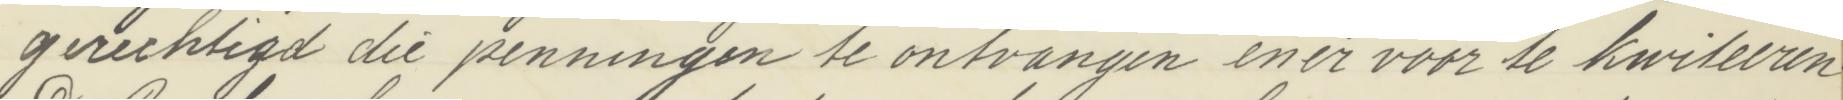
gerechtigd die penningen te ontvangen en er voor te kwiteeren
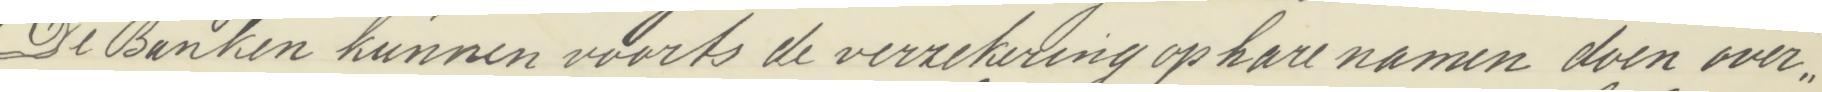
De Banken kunnen voorts de verzekering op hare namen doen over„
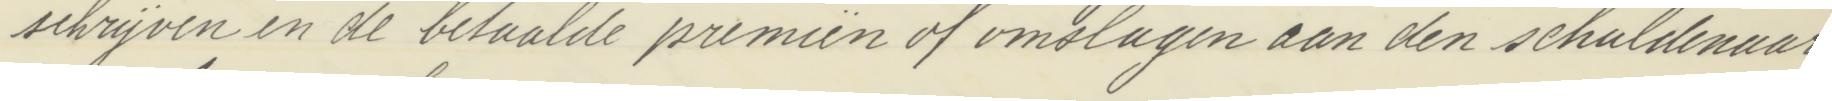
schrijven en de betaalde premiën of omslagen aan den schuldenaar
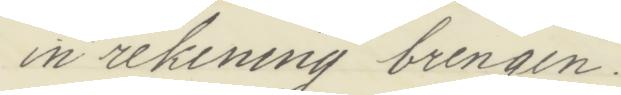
in rekening brengen.
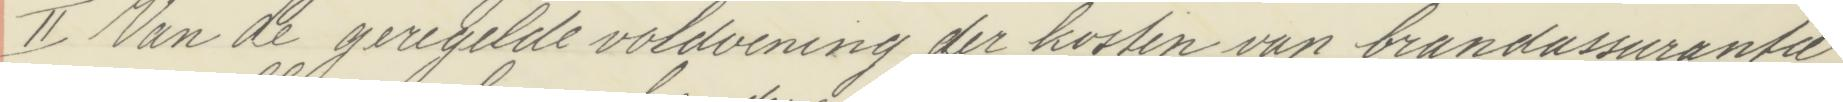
II Van de geregelde voldoening der kosten van brandassurantie
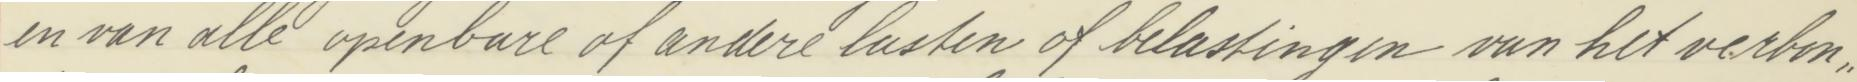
en van alle openbare of andere lasten of belastingen van het verbon„
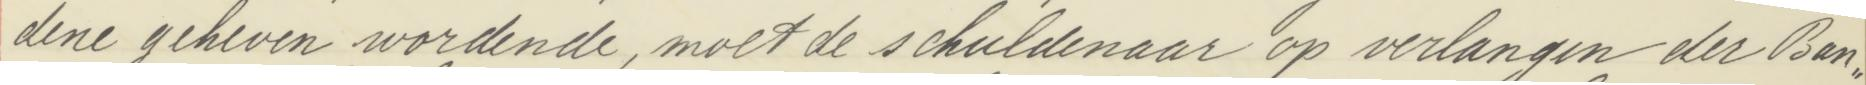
dene geheven wordende, moet de schuldenaar op verlangen der Ban„
